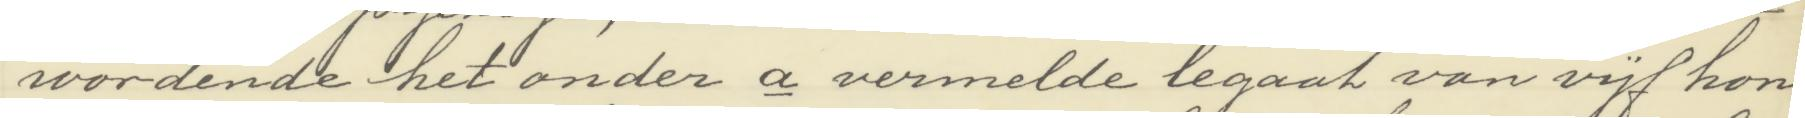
wordende het onder a vermelde legaat van vijf hon
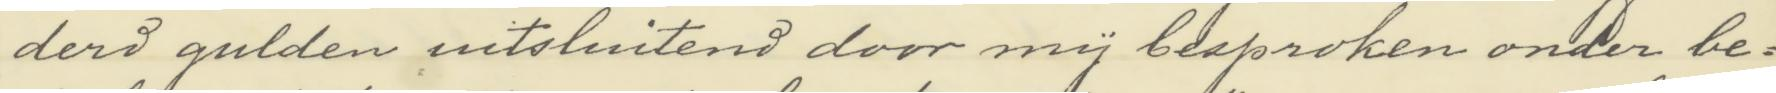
derd gulden uitsluitend door mij besproken onder be„
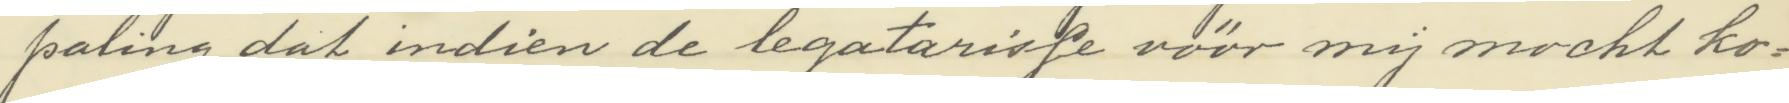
paling dat indien de legatarisse vóór mij mocht ko=
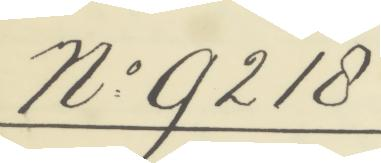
N:o 9218
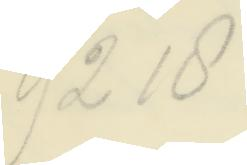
9218
